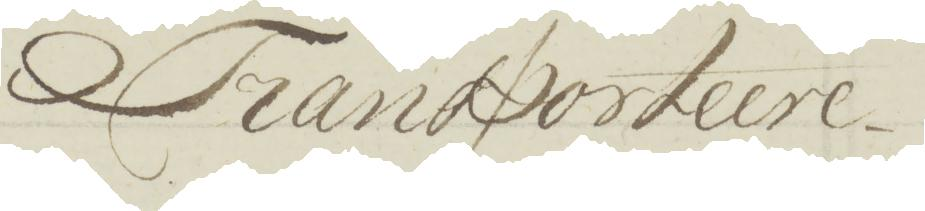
Transporteere_
